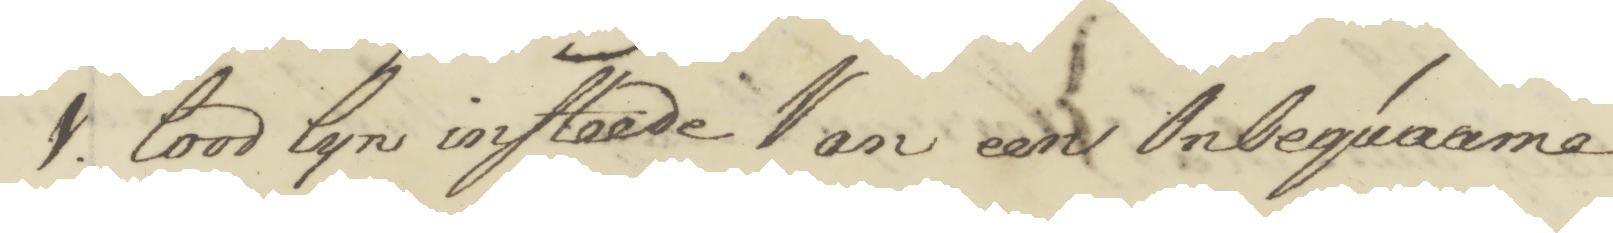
1. lood lyn insteede Van een Onbequaame
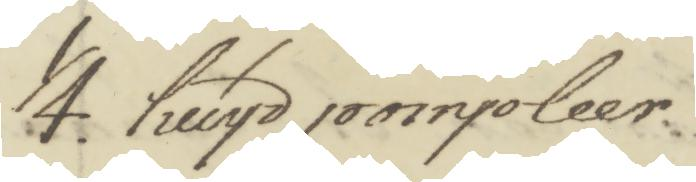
¼. huyd pompleer
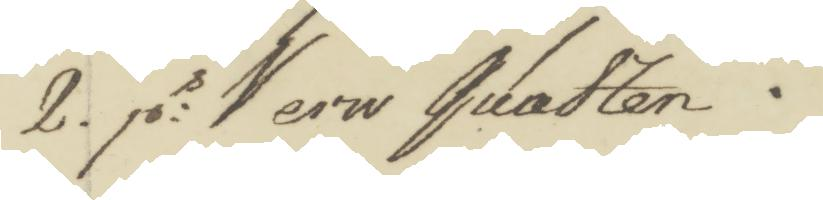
2. p:s Verw Quasten.
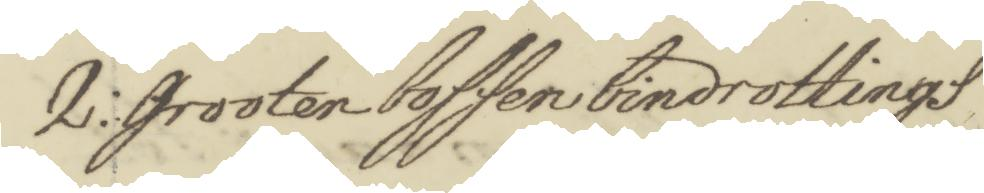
2: Grooten bossen bindrottings
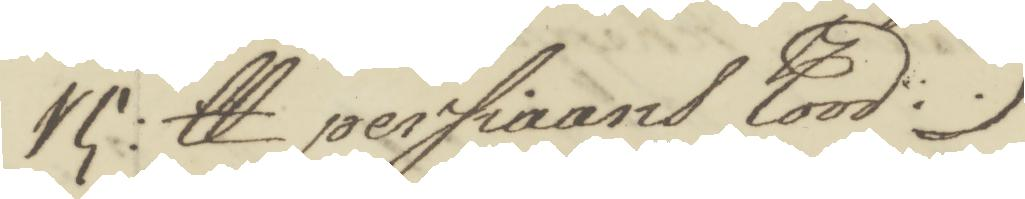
15: lb persiaans Rood:
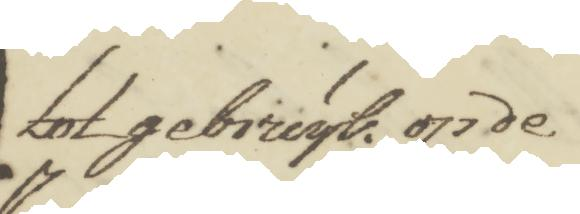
tot gebruyk op de
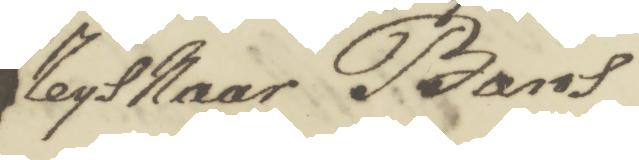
reys Naar Baros
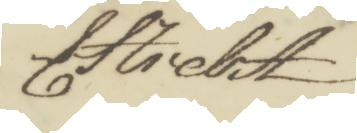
verstrekt
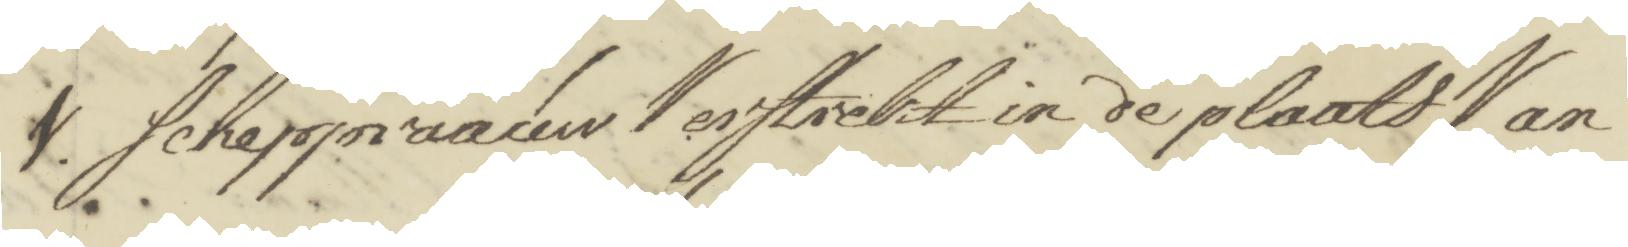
1. scheppraauw Verstrekt in de plaats Van
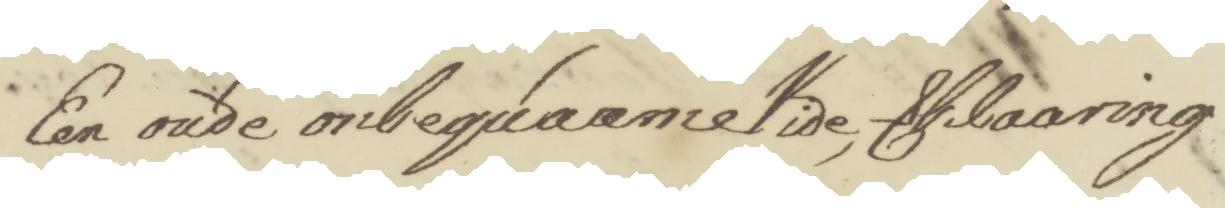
Een oude onbequaame Vide, verklaaring
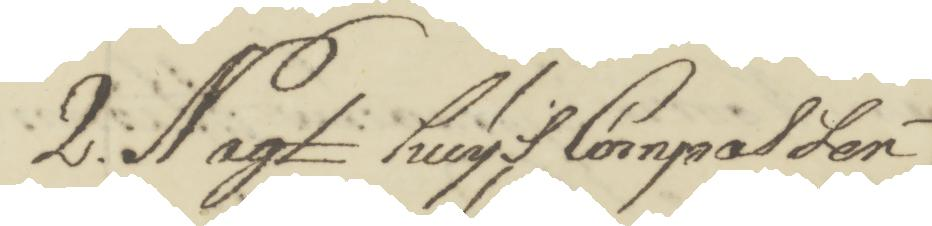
2. Nagt huys Compassen
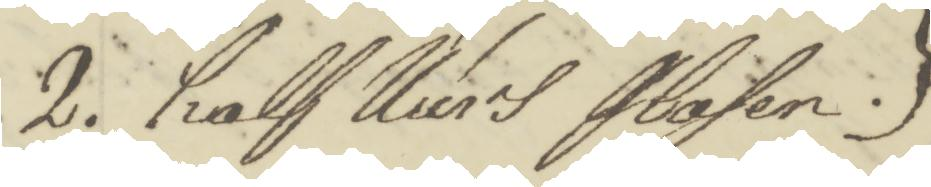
2. half Uurs Glasen
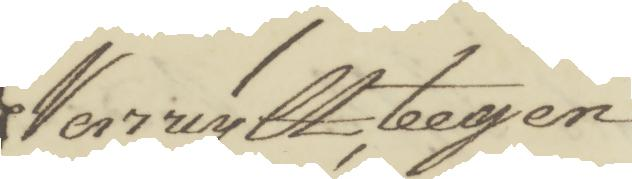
Verruylt teegen
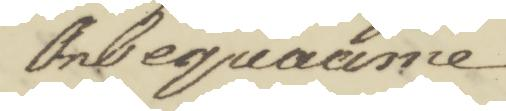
Onbequaame
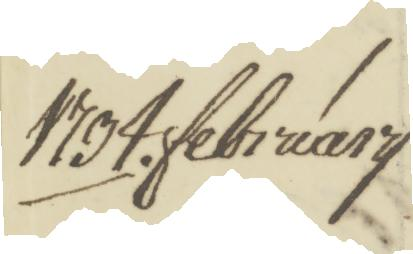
1734. february
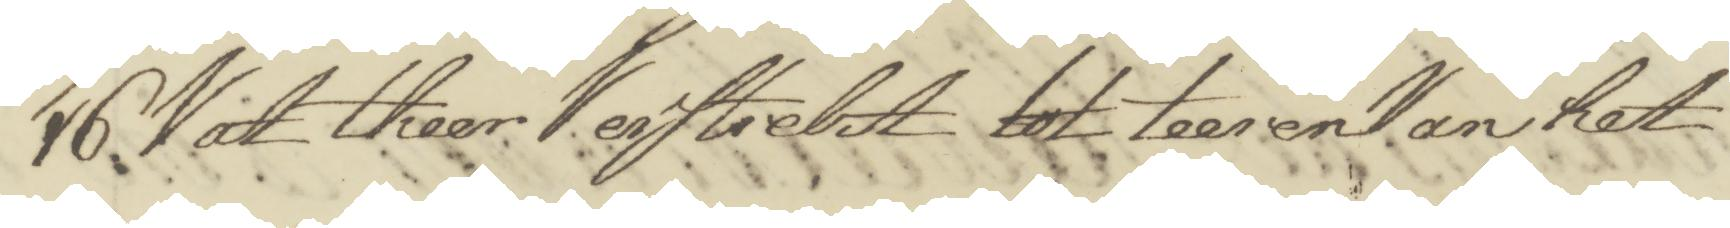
16. Vat theer verstrekt tot teeren Van het
